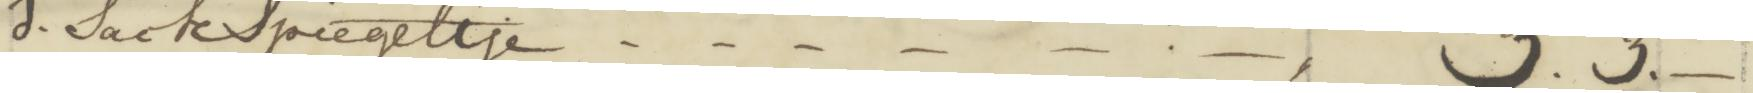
1. sackspiegeltje - - - - - - „ 3. 3. —
